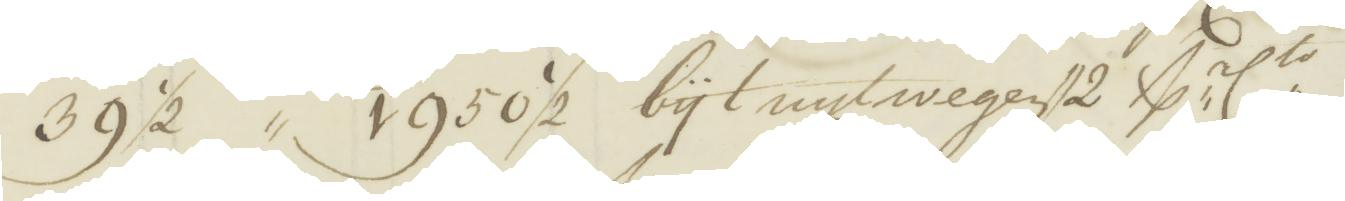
39 ½ „ 3950 ½ bij t uytwegen „ 2 p„r C„to
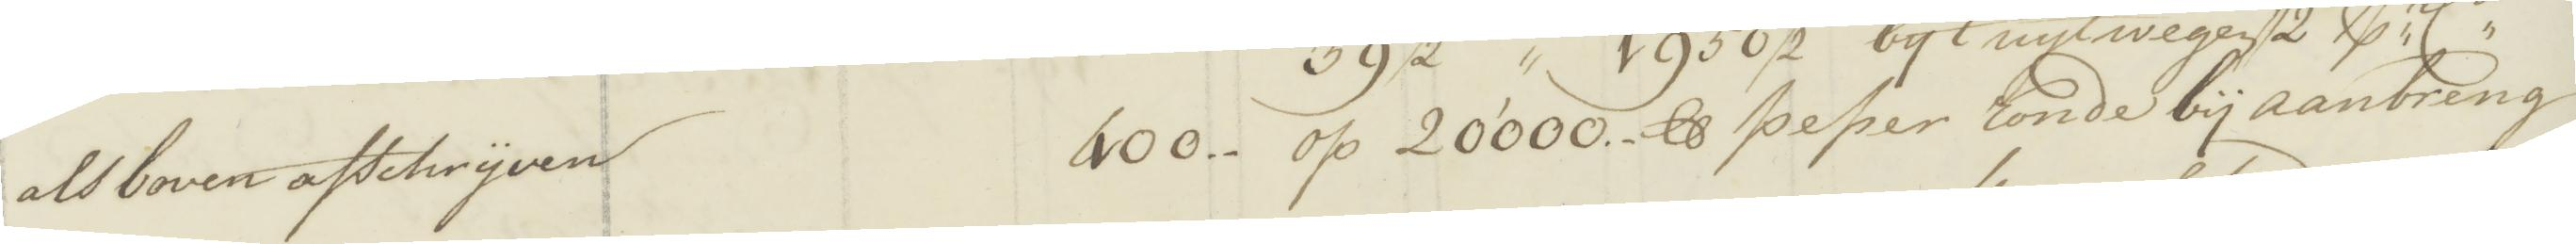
als boven afschrijven 400. - op 20'000. - lb peper ronde bij aanbreng
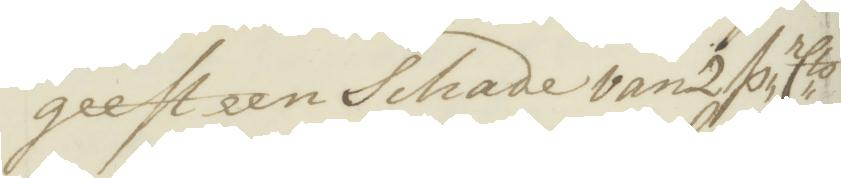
geeft een Schade van 2 p„r C„to
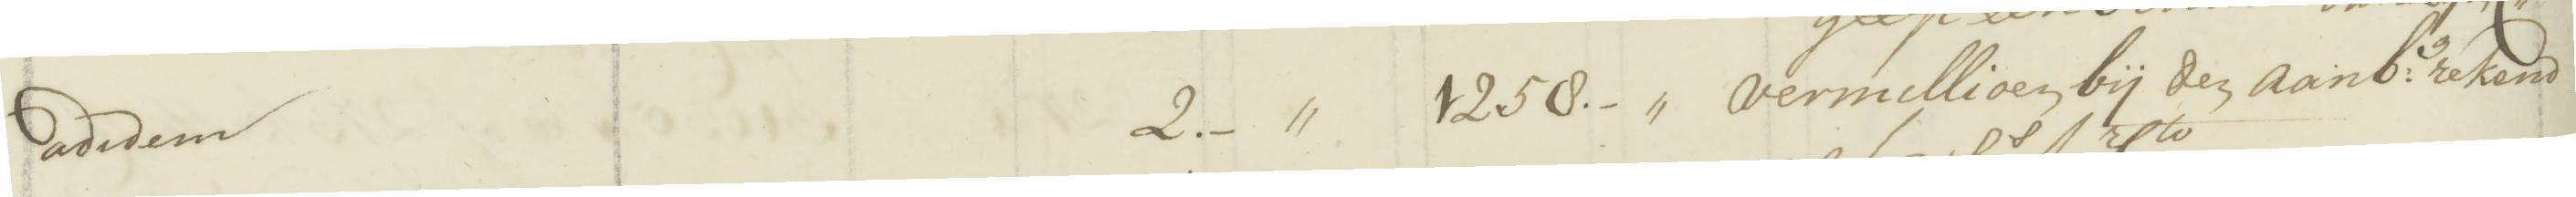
adidem 2. - „ 1258. - „ vermillioen bij den aanb:g rekend
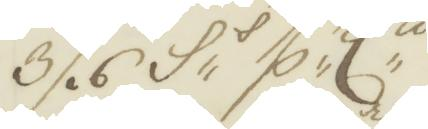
3/16 S„s p„r C„to
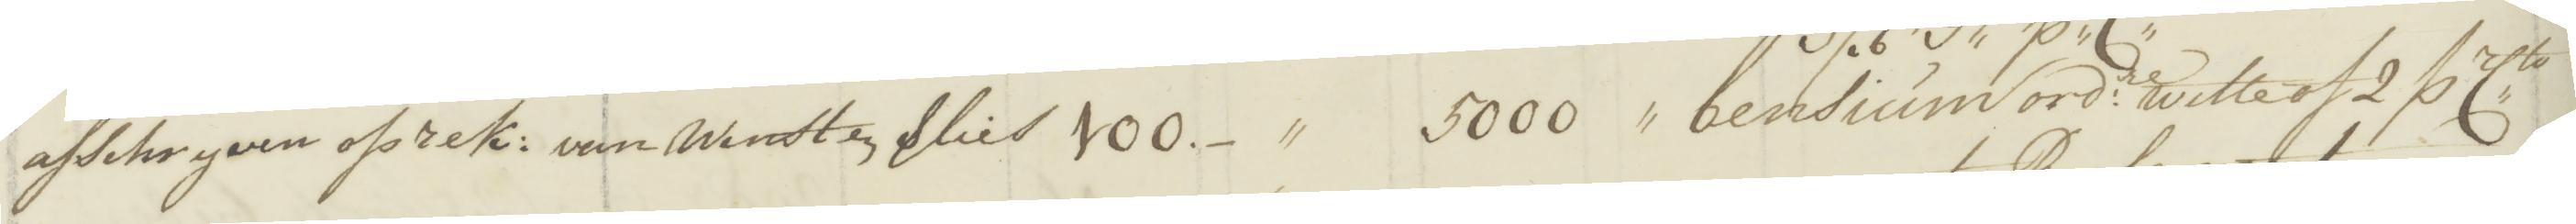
afschrijven op rek: van winst en verlies 100. — „ 5000 „ bensium ord:re witte of 2 pr C„to
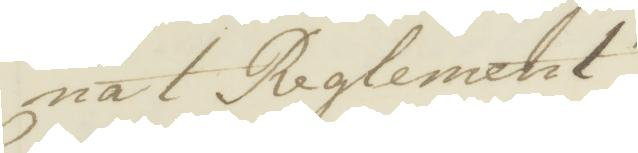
na t Reglement
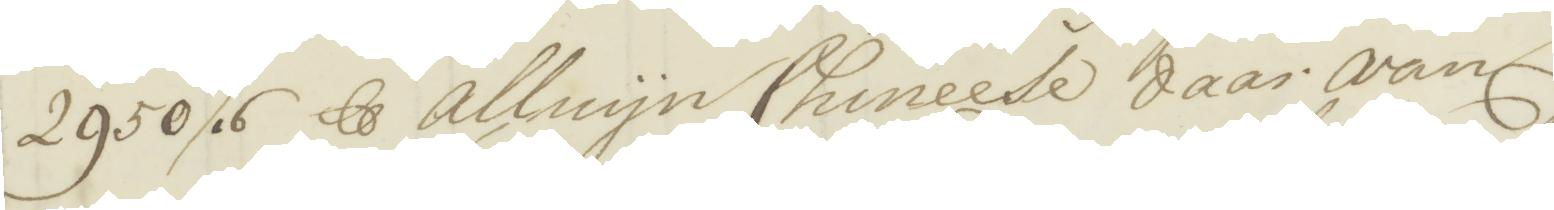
2950 11/16 lb alluijn Chineese daar van
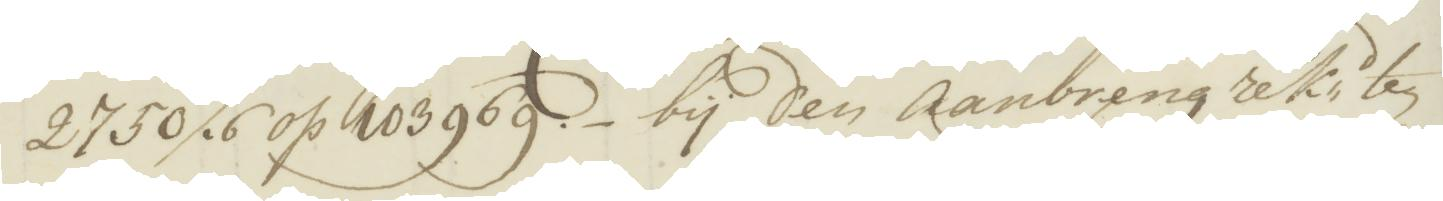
2750 15/16 op 103969. - bij den aanbreng rek„d ten
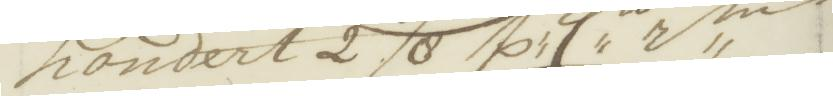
hondert 2 5/8 p„r C„to r„m
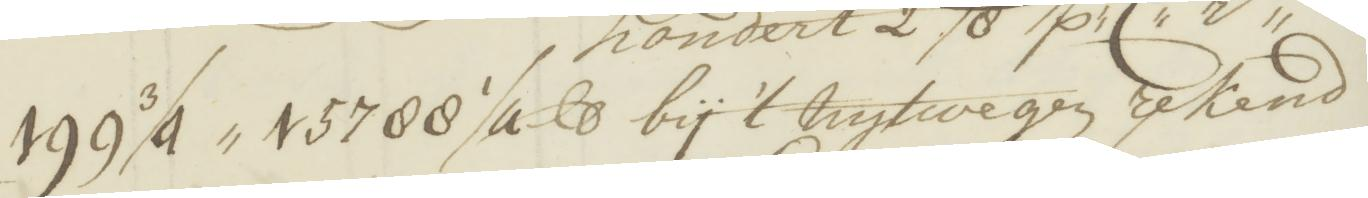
199 3/4 „ 15788 1/4 lb bij ’t uytwegen rekend
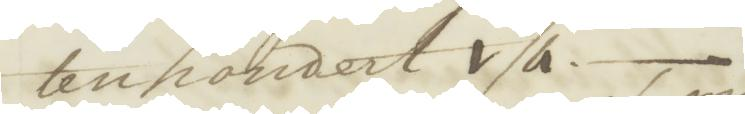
ten houdert 1 1/4. —
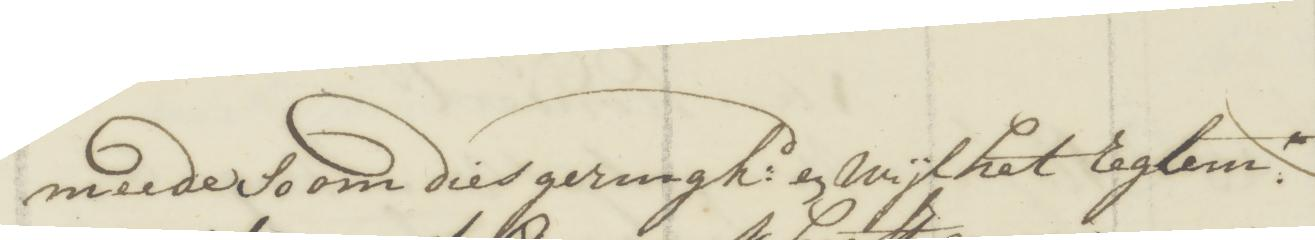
meede so om dies geringh:d en wijl het reglem:t
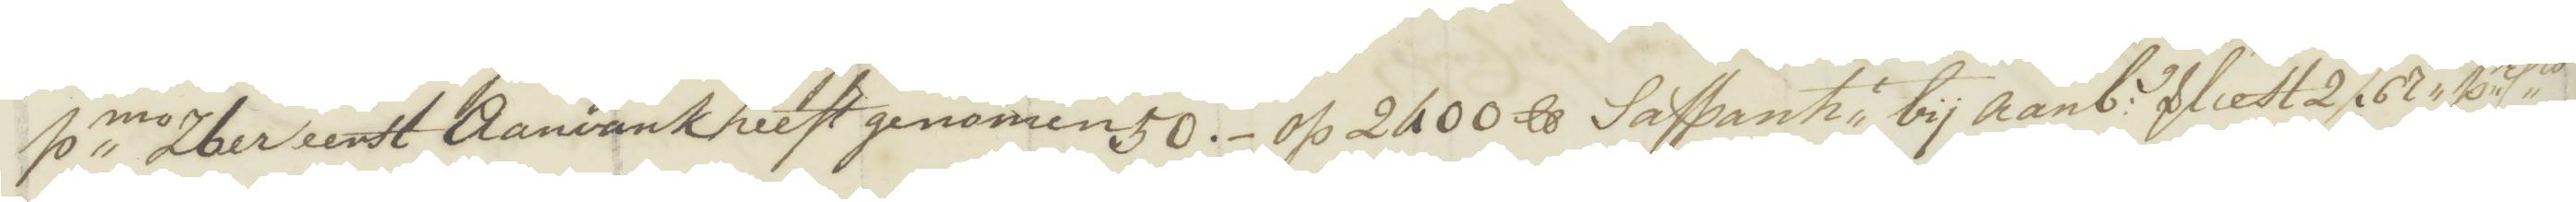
p„mo 7ber eerst Aanvank heeft genomen 50. - op 2400 lb sappanh„t bij aanb:g verliest 2 1/16 r„m p„r C„to
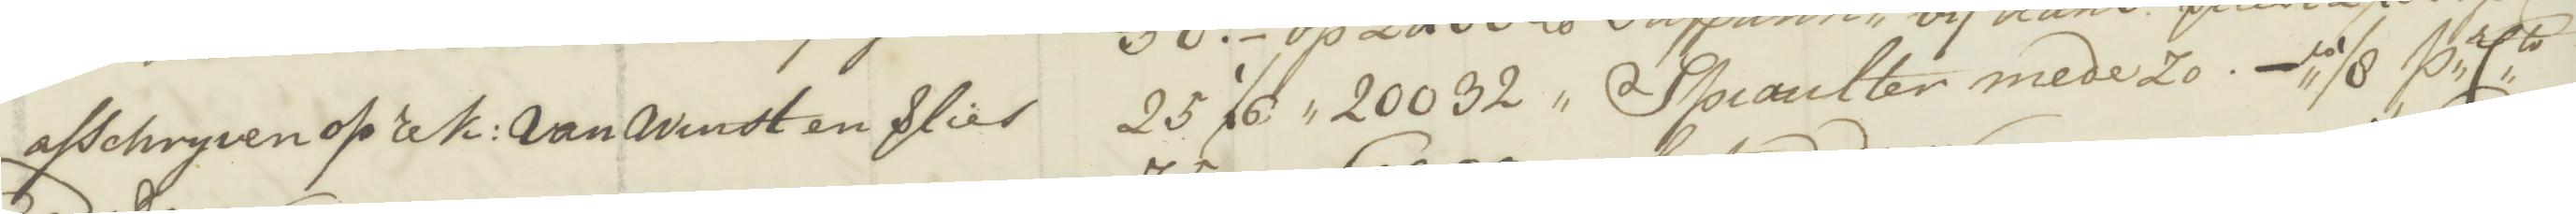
afschrijven op rek: van winst en verlies 25 1/16 „ 20032 „ Spiaulter mede zo _„o 1/8 p„r C„to
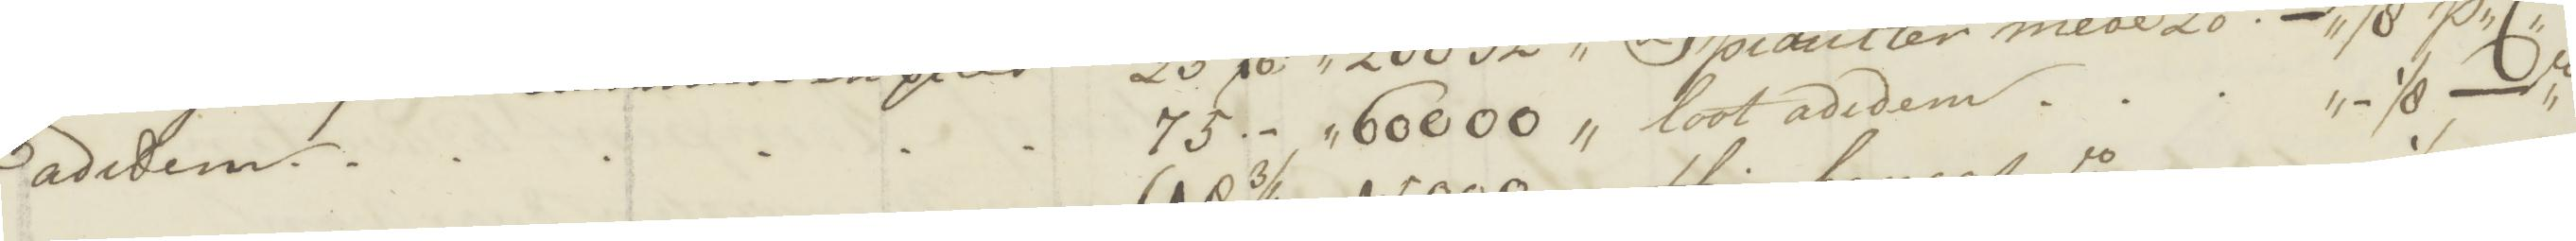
adidem - - - - - - 75. - „ 60000 „ loot adidem . . . „ - 1/8 _„o
